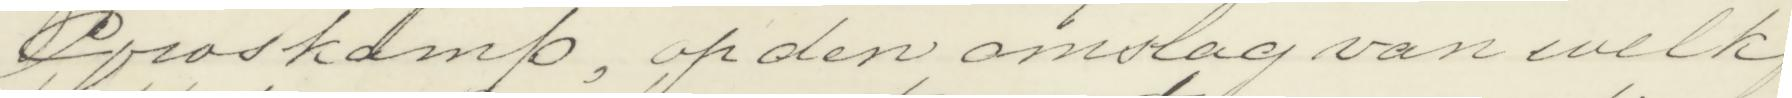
Groskamp, op den omslag van welk
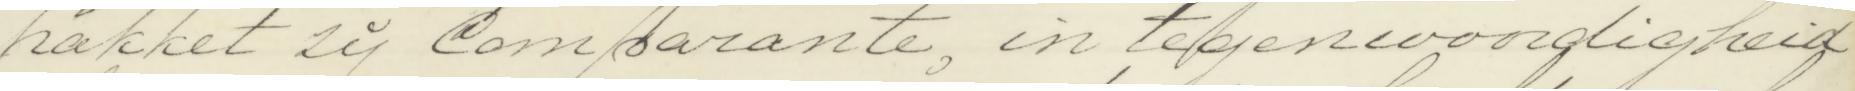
pakket zij Comparante, in tegenwoordigheid
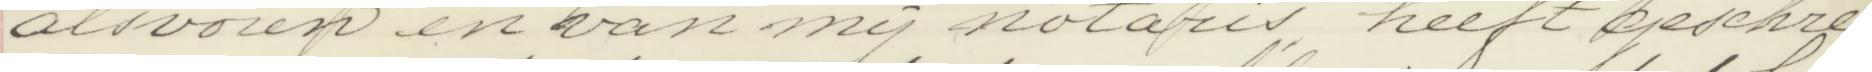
als voren en van mij notaris heeft geschre
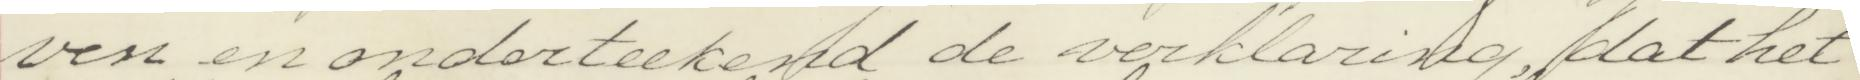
ven en onderteekend de verklaring, dat het
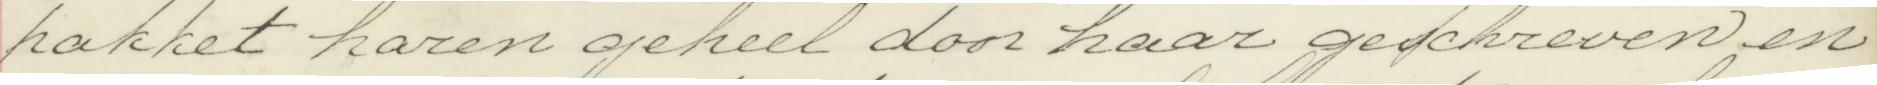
pakket haren geheel door haar geschreven en
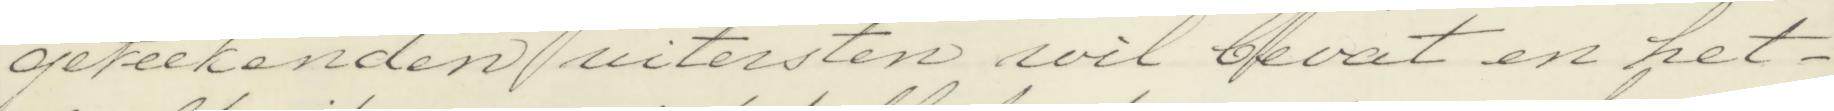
geteekenden uitersten wil bevat en het-
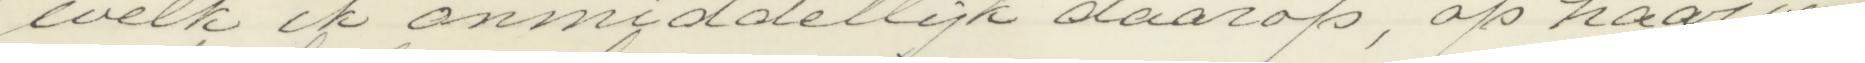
welk ik onmiddellijk daarop, op haar ver
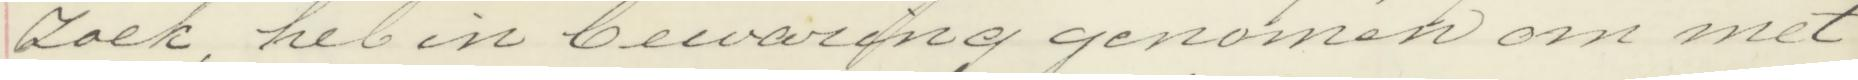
zoek, heb in bewaring genomen om met
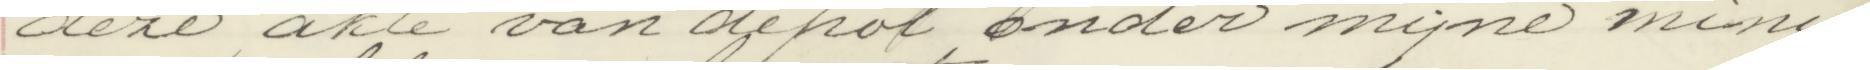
deze akte van depot onder mijne minu
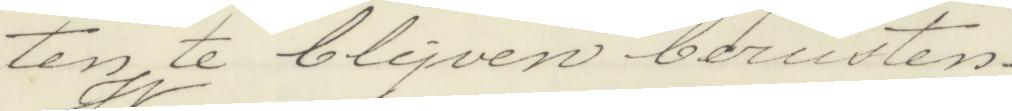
ten te blijven berusten
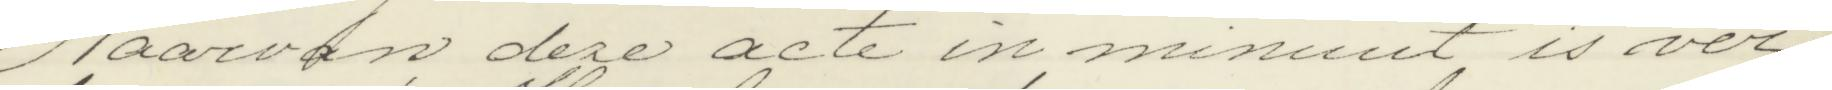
Waarvan deze acte in minuut is ver-
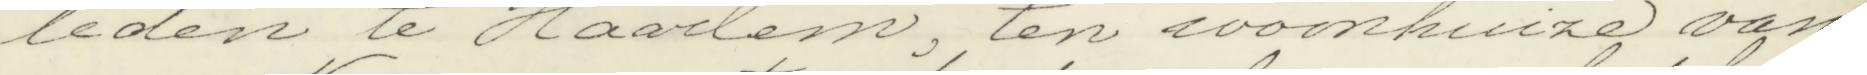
leden te Haarlem, ten woonhuize van
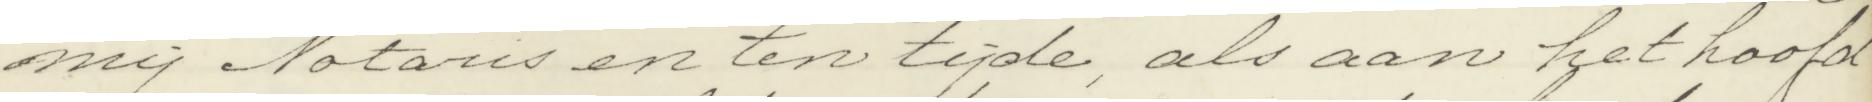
mij Notaris en ten tijde, als aan het hoofd
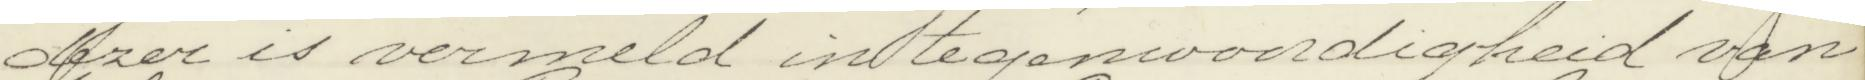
dezer is vermeld in tegenwoordigheid van
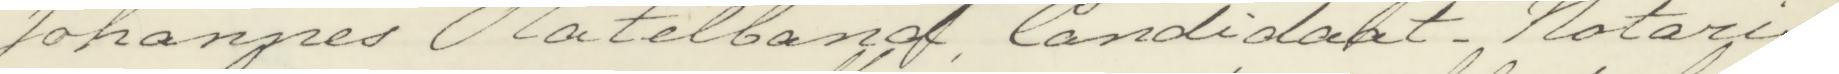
Johannes Ratelband, Candidaat - Notaris
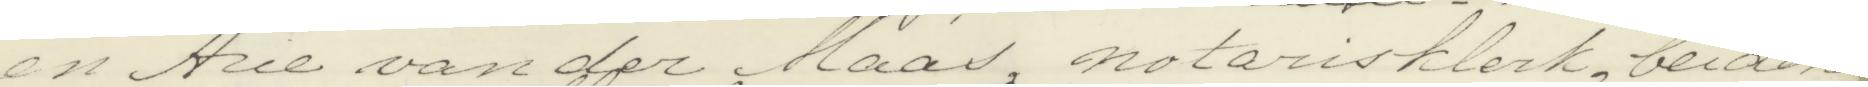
en Arie van der Maas, notarisklerk, beiden
